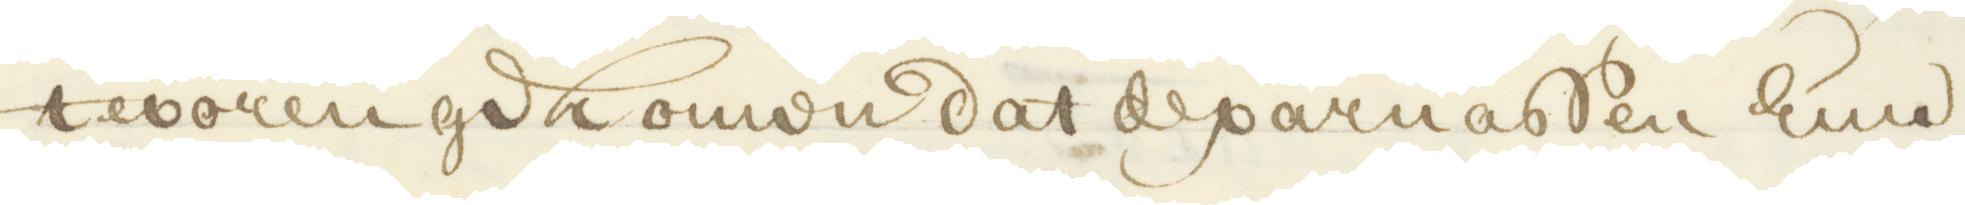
tevoren gekomen dat de paruassen hun
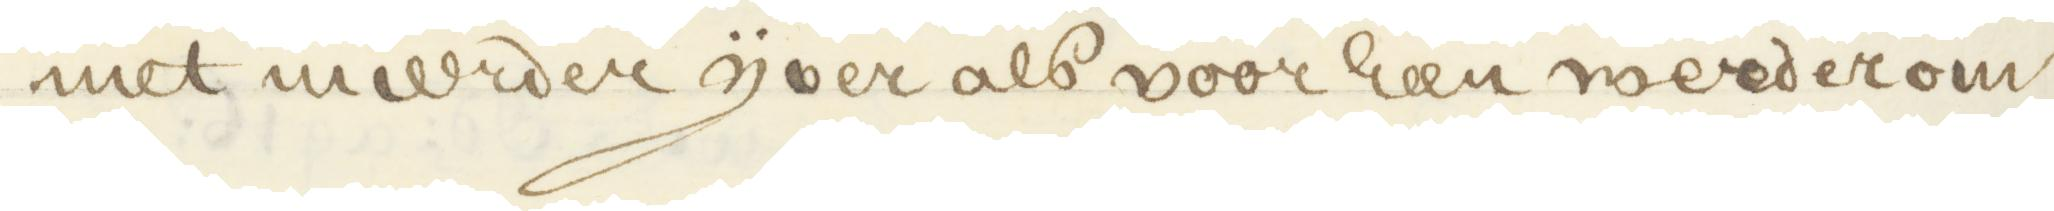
met meerder ijver als voor heen werderom
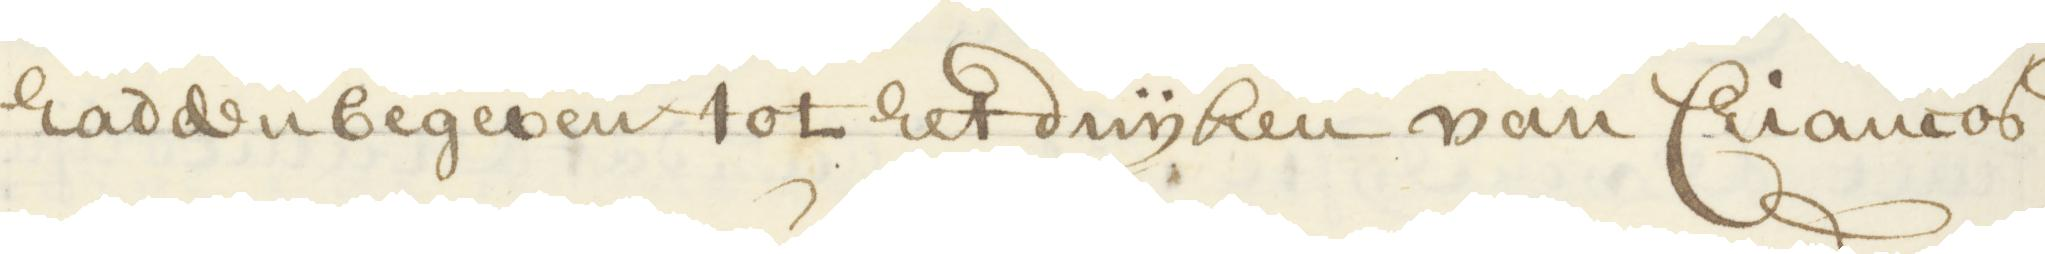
hadden begeven tot het duijken van Chiancos
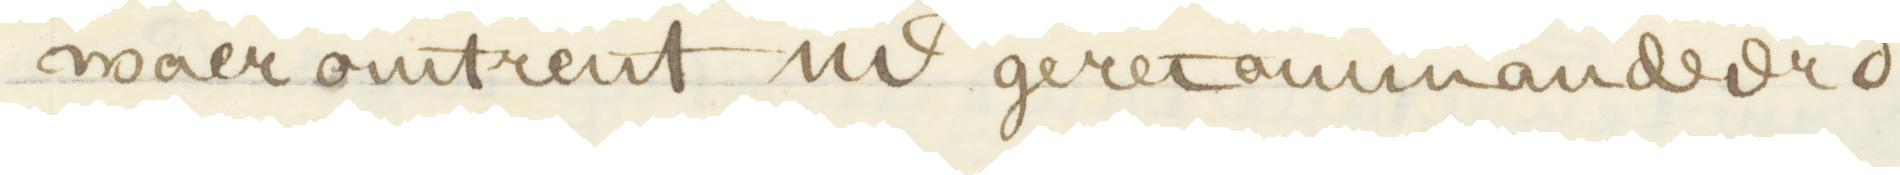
waer omtrent uE gerecommandeerd
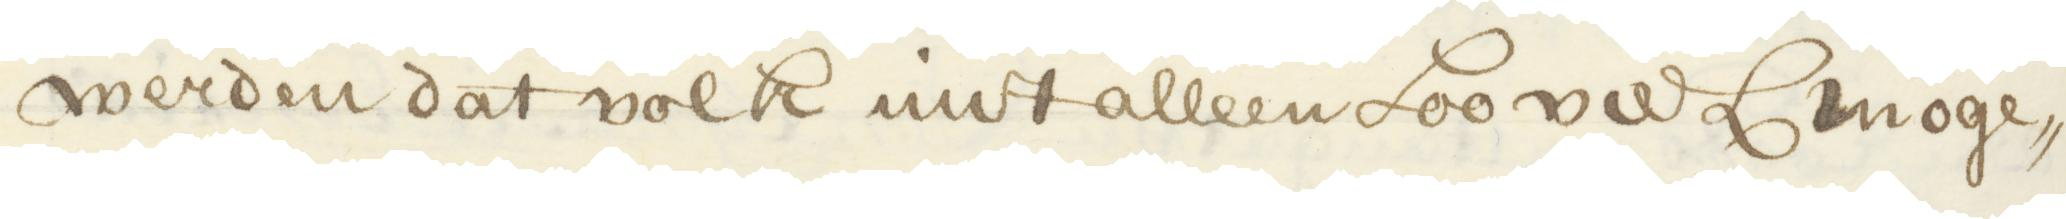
werden dat volk niet alleen soo veel moge„
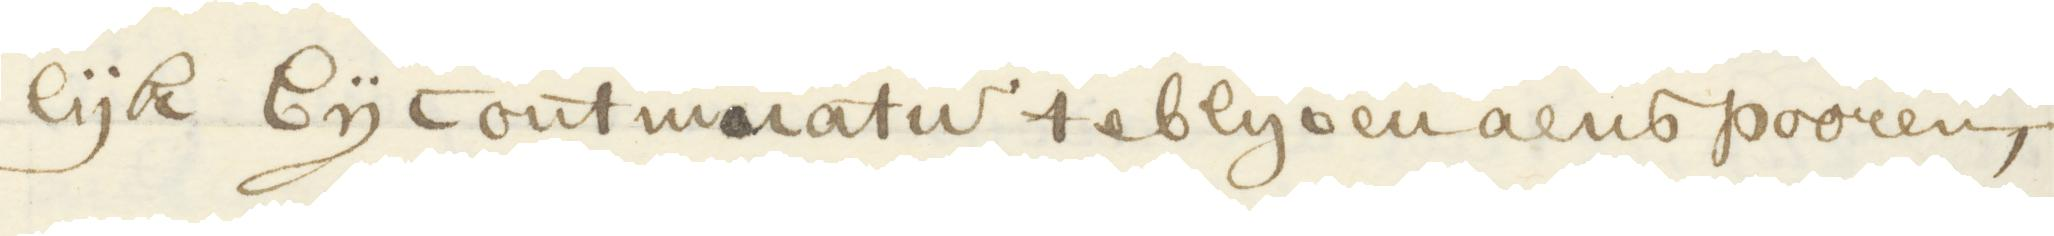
lijk bij continuatie te blijven aenspooren,
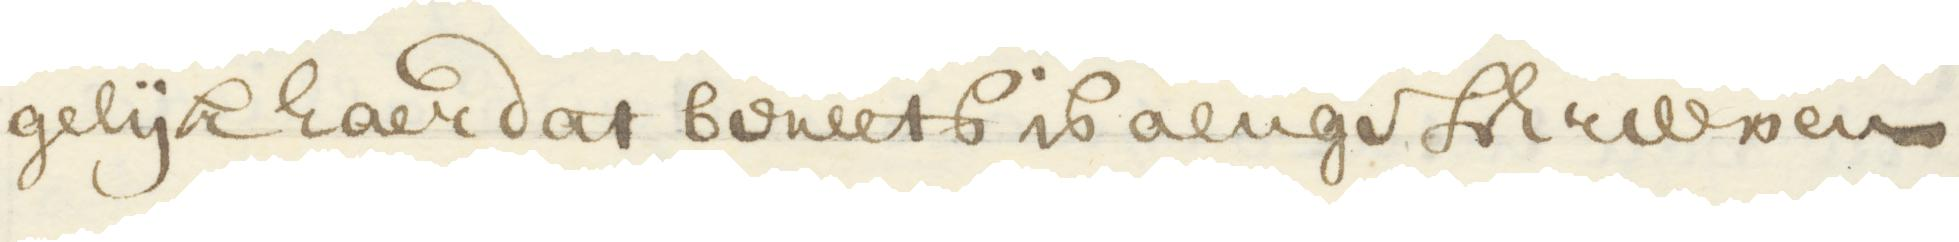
gelijk haer dat bereets is aengeschreeven
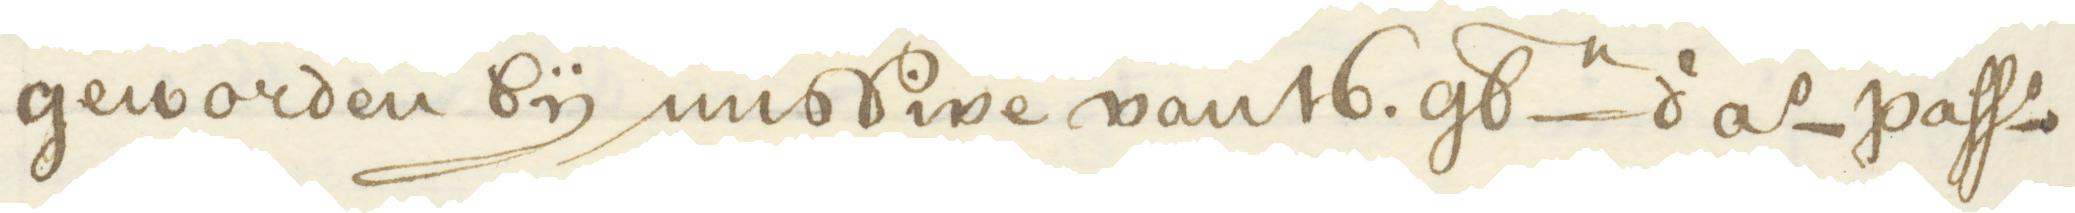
geworden bij missive van 16. 9b=r d’ a_o pass_o
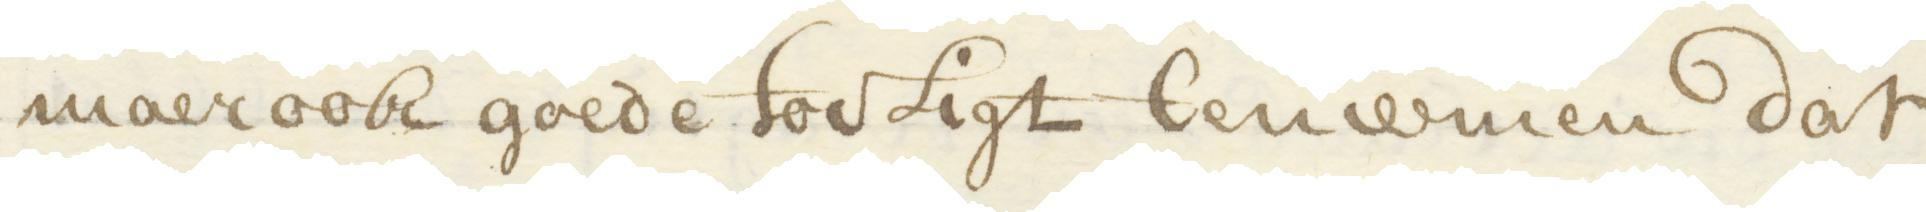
maer ook goede toesigt beneemen dat
